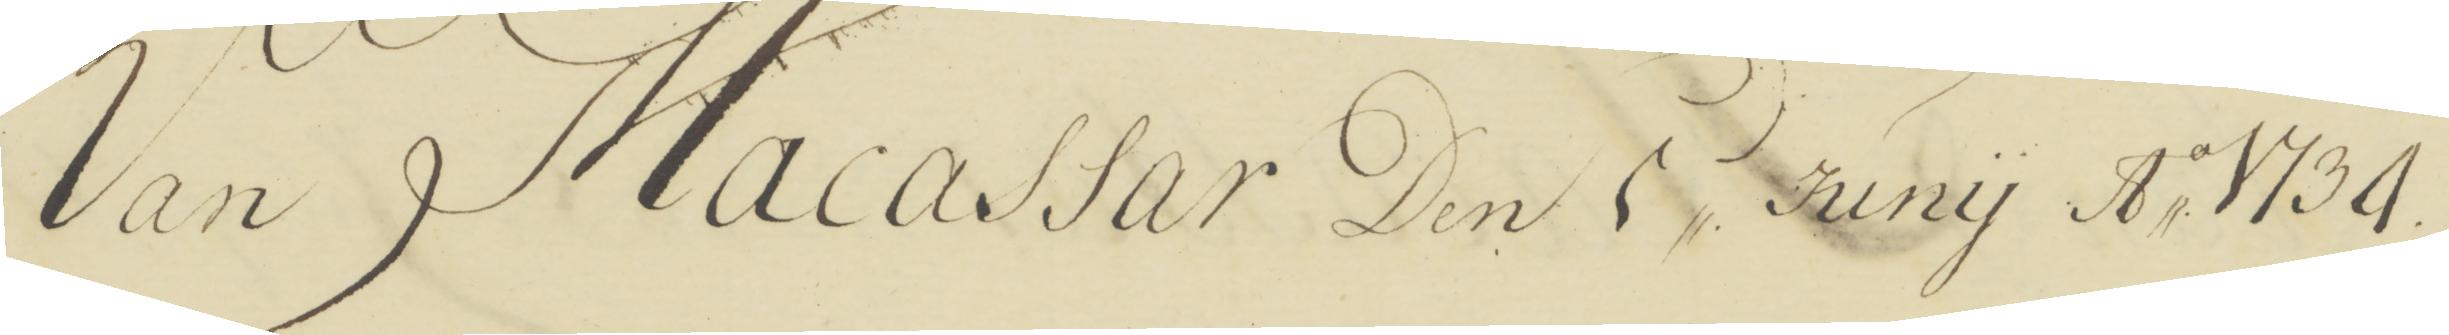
Van Macassar Den 5„' Junij A„o 1734.
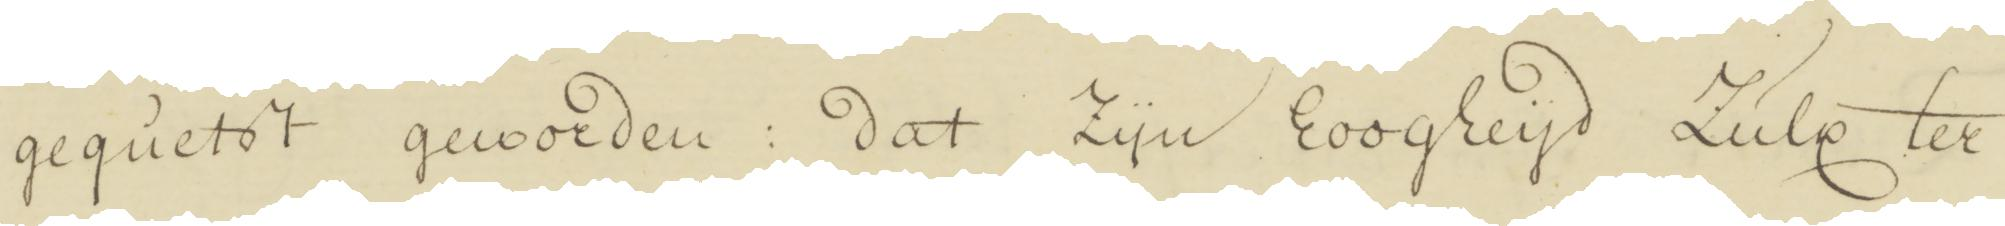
gequetst geworden: dat zijn hoogheijd zulx ter
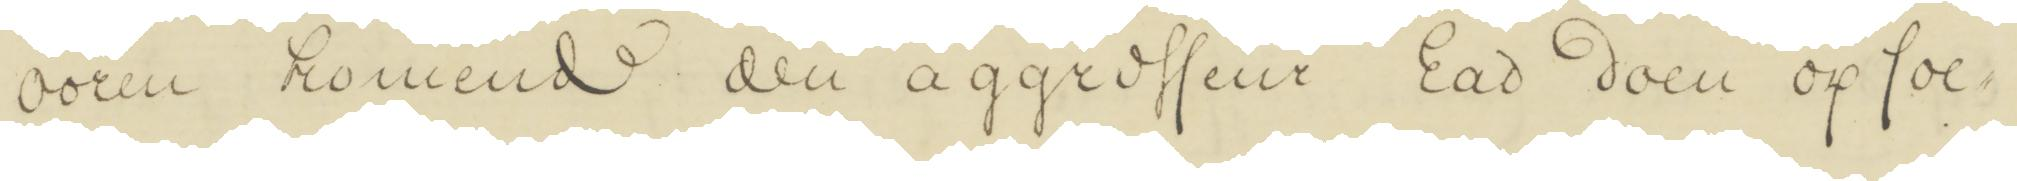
ooren komende den aggresseur had doen op soe„
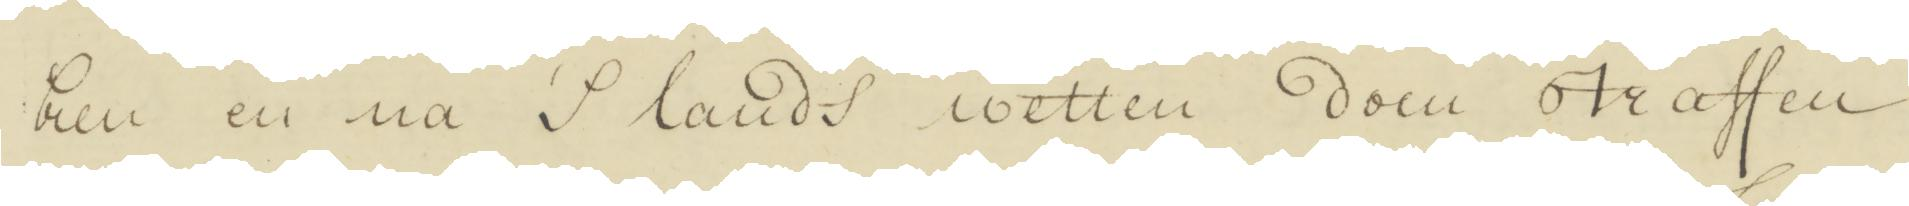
ken en na 's lands wetten doen straffen
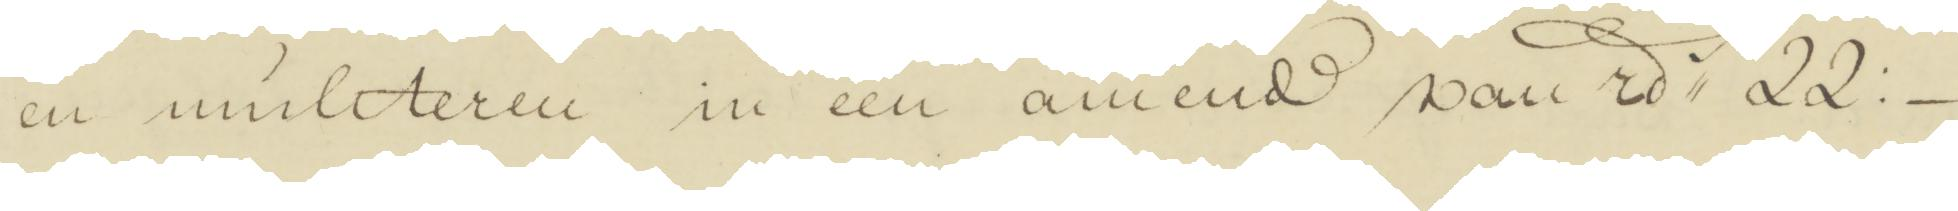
en muliteren in een amende van rd„s 22: —
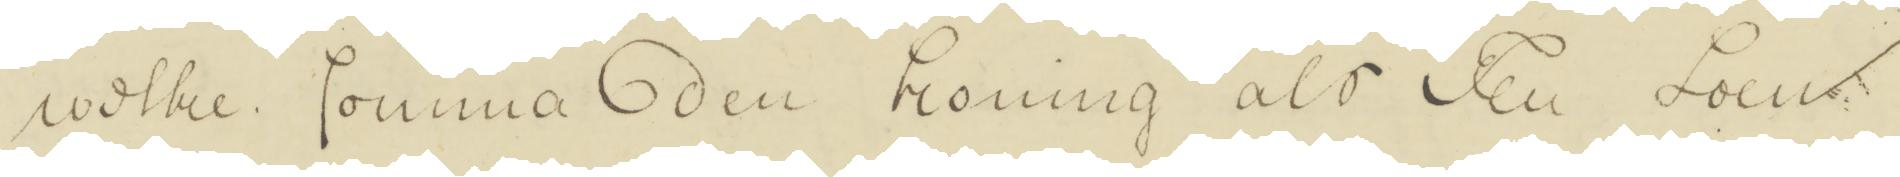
welke somma den koning als Een soen
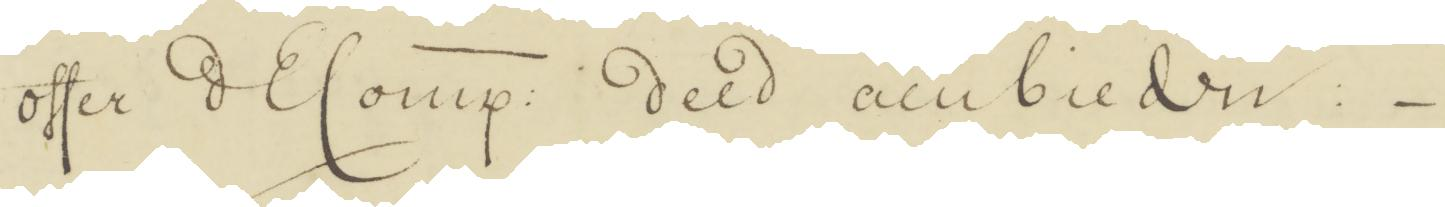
offer d EComp: deed aenbieden: —
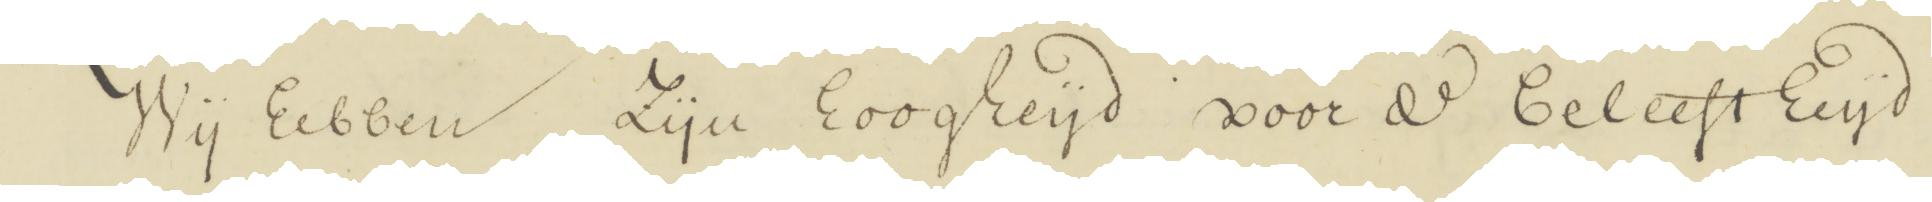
Wij hebben zijn hoogheijd voor de beleeftheijd
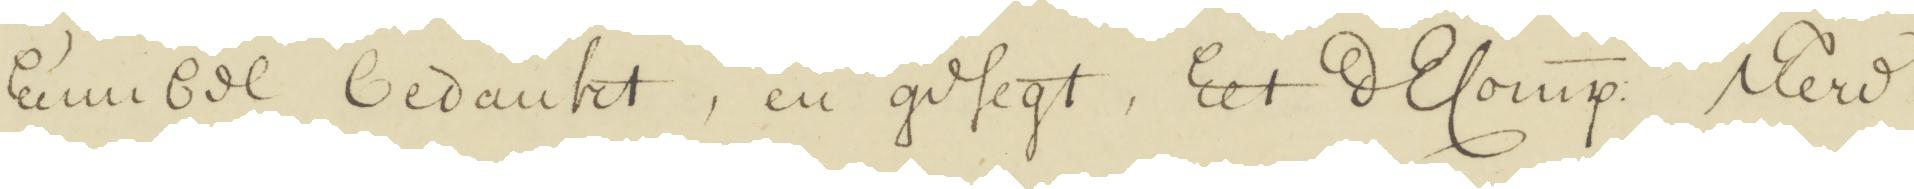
humbel bedankt, en gesegt, het d EComp: Eere
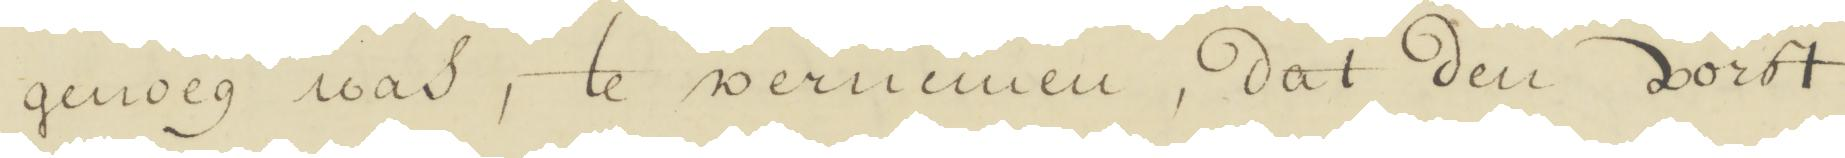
genoeg was, te vernemen, dat den vorst
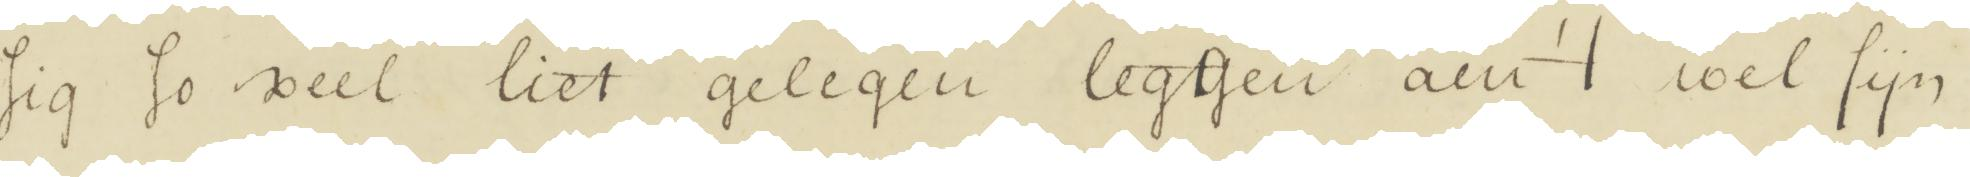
sig so veel liet gelegen leggen aen ’t wel sijn
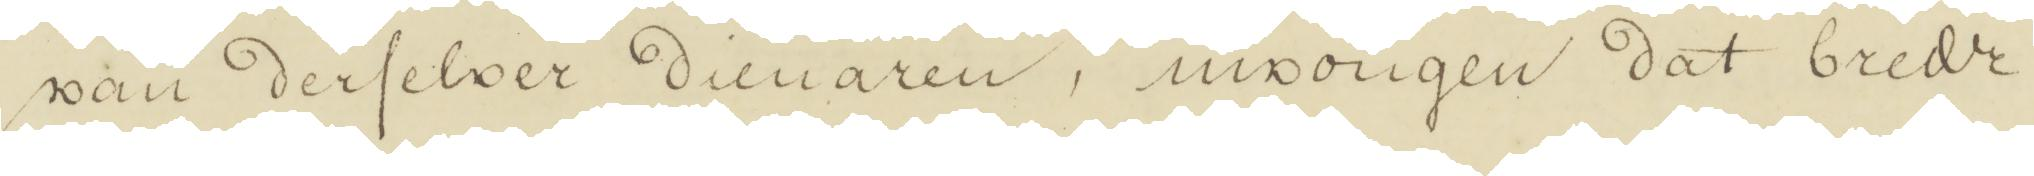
van derselver dienaren, invougen dat breder
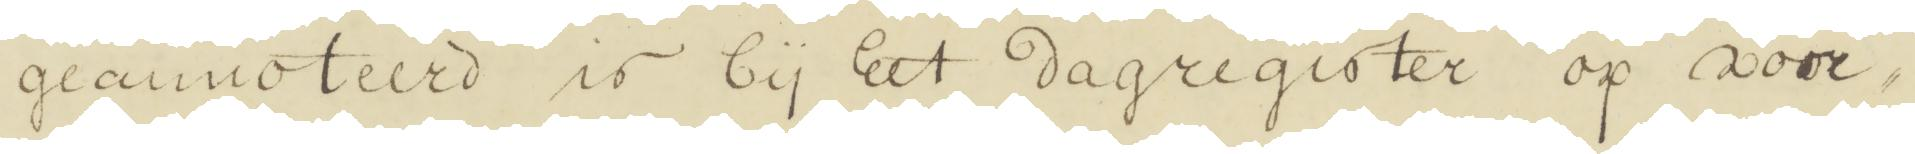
geannoteerd is bij het dagregister op voor„
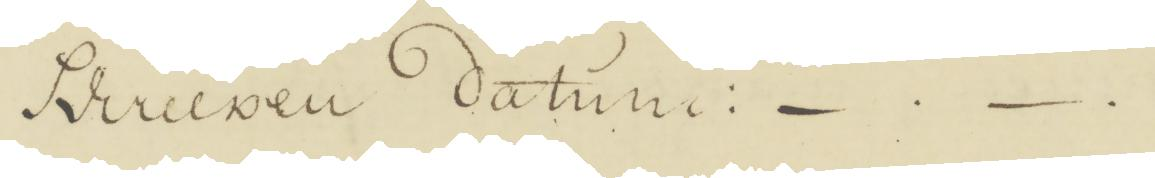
schreeven datum: — . — .
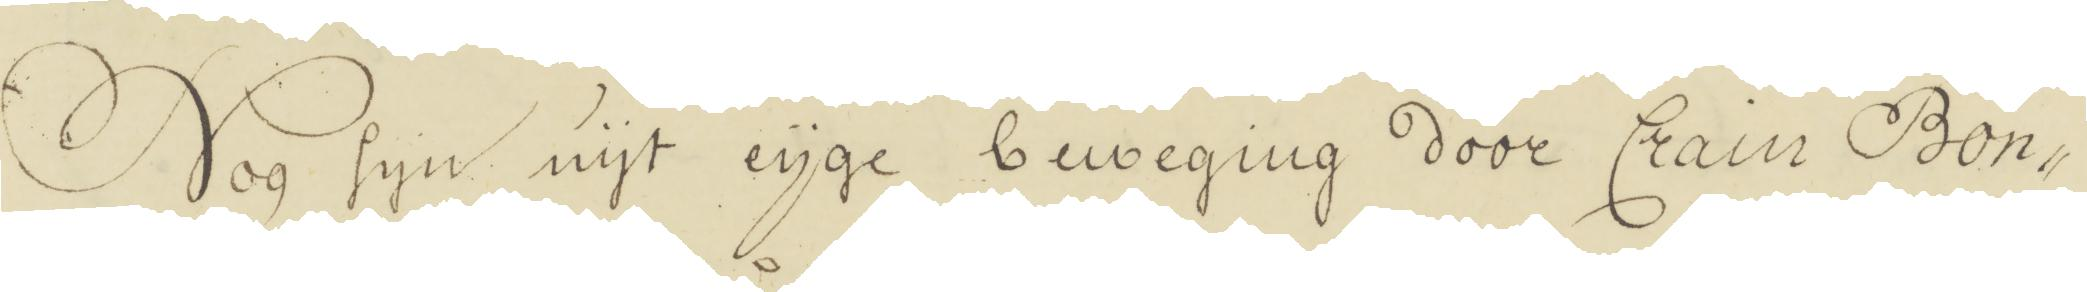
Nog sijn uijt eijge beweging door Crain Bon„
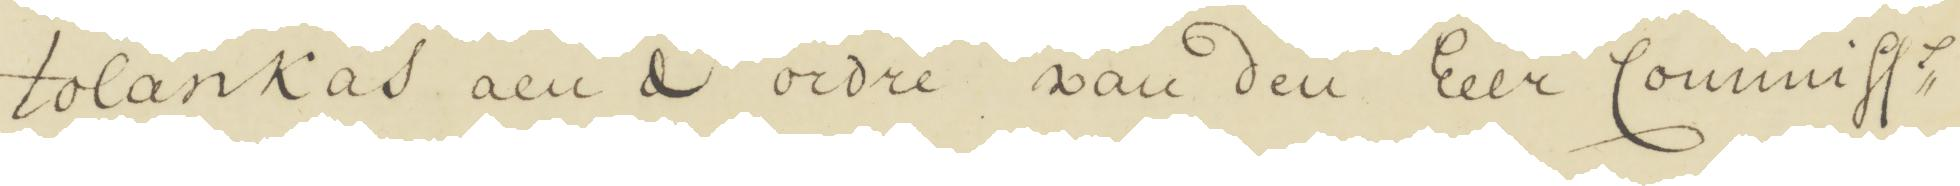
tolankas aen de ordre van den heer Commiss„s
